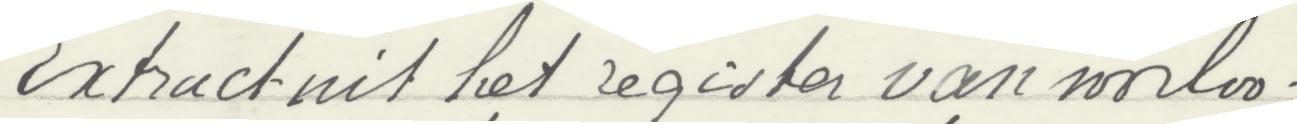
Extract uit het register van voorloo
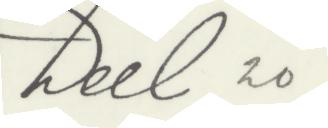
Deel 20
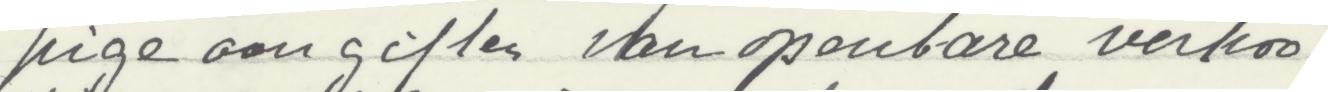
pige aangiften van openbare verkoo-
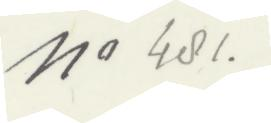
No 481.
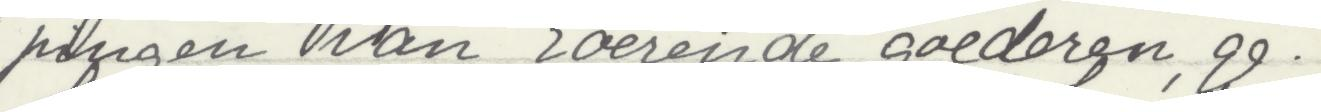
pingen van roerende goederen, ge.
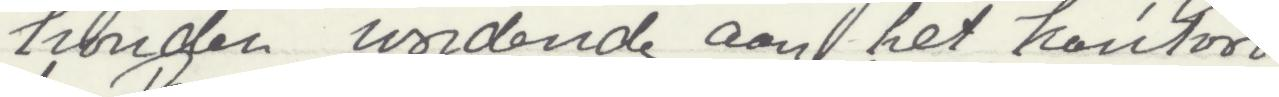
houden wordende aan het kantoor
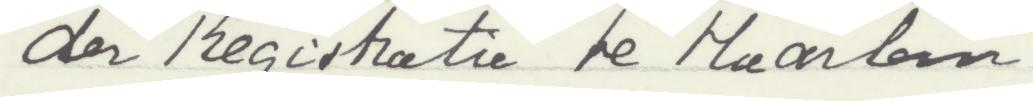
der Registratie te Haarlem
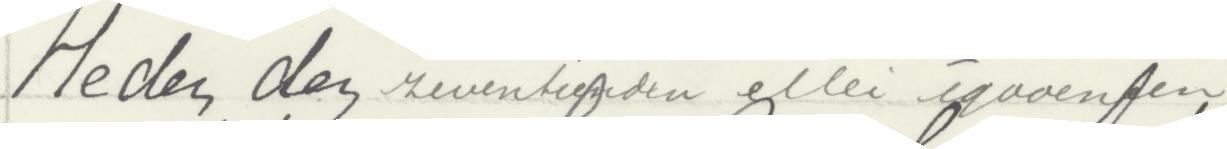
Heden den zeventienden 1900 en een
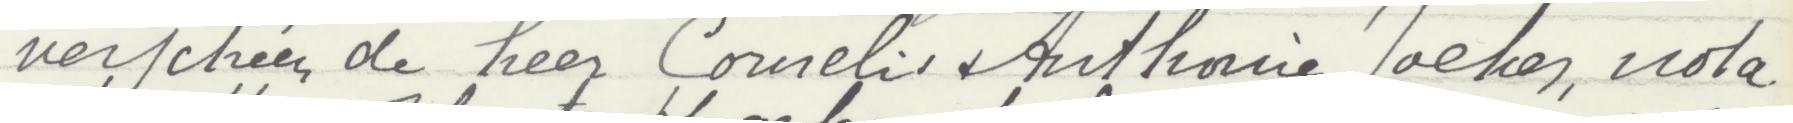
verscheen de heer Cornelis Anthonie Joekes, nota.
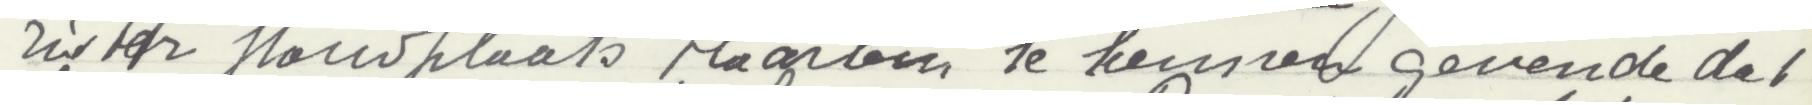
is ter standplaats Haarlem te kennen gevende dat
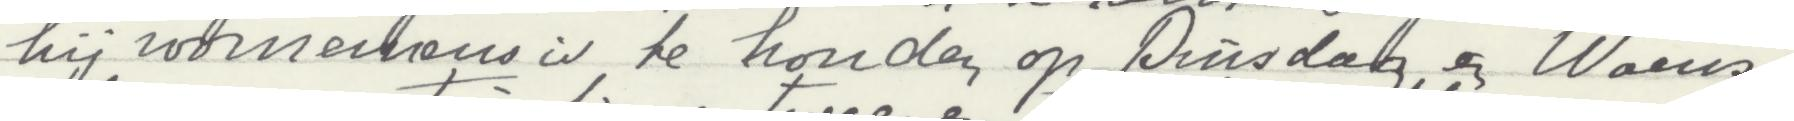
hij voornemens is te houden op Dinsdag en Woens-
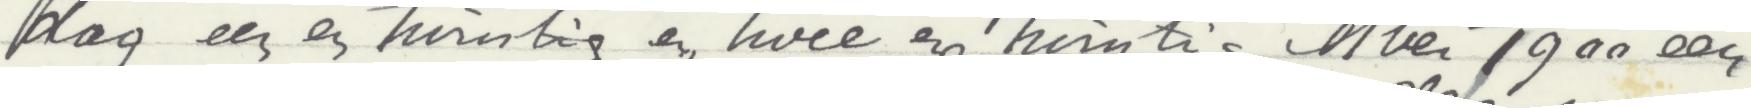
dag een en twintig en twee en twintig Mei 1900 een
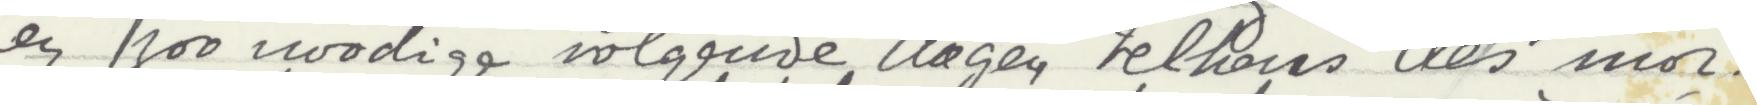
en zoo noodige volgende dagen telkens des mor.
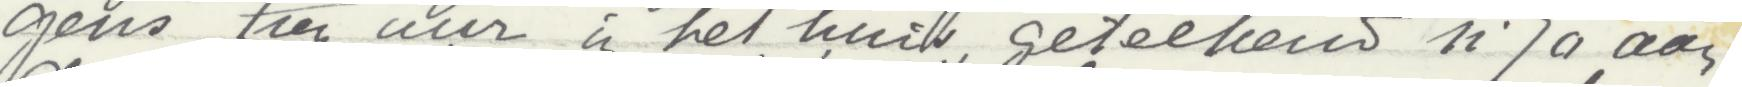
gens tien uur in het huis geteekend n' 70 aan
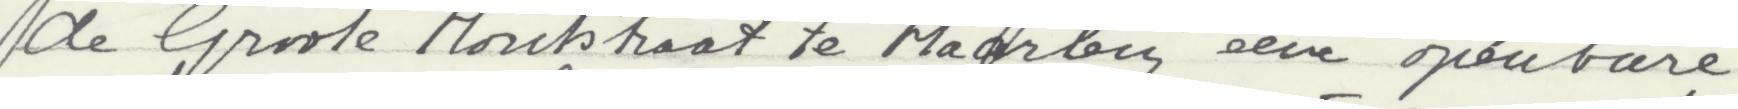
de Groote Houtstraat te Haarlem eene openbare
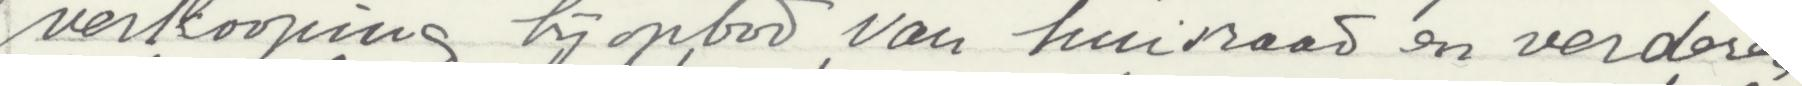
verkooping bij opbod van huisraad en verderen
